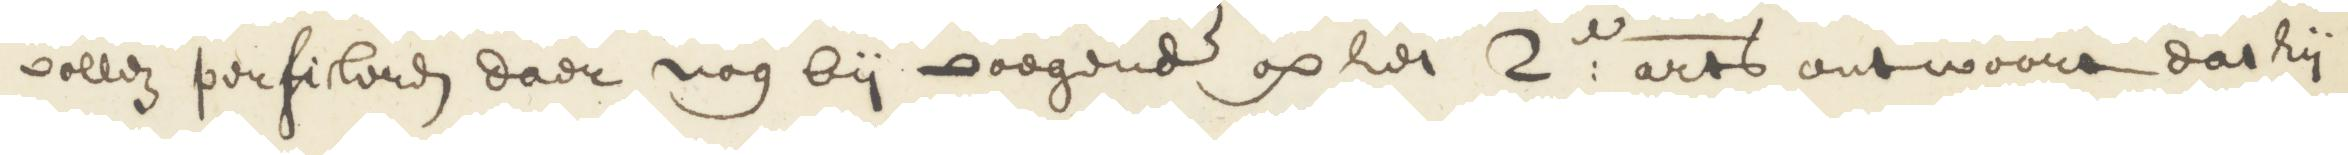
vollen persisteren daer nog bij voegende op het 2:e artl antwoort dat hij
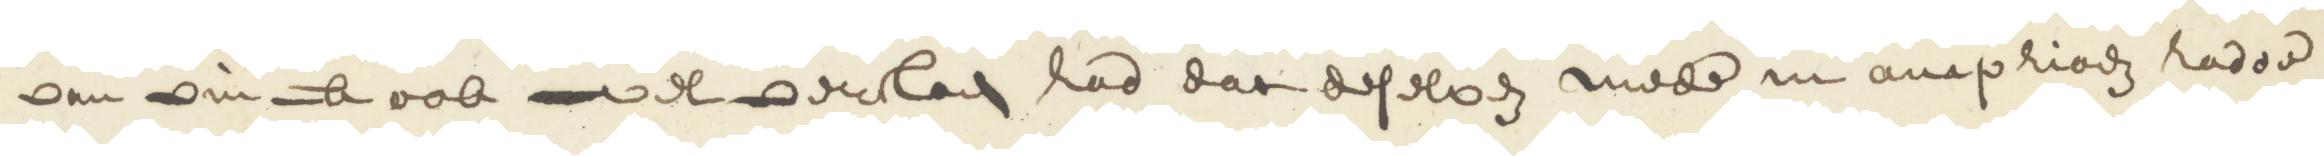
van vinck ook wel verstaen had dat deselven mede in amphioen hadde
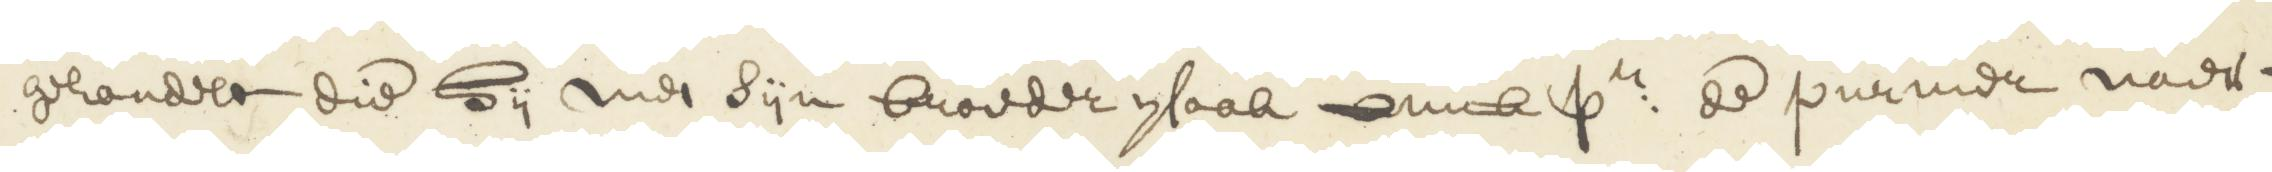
gehandelt die hij met sijn broeder ijsaak vinck p:r de purmer naer
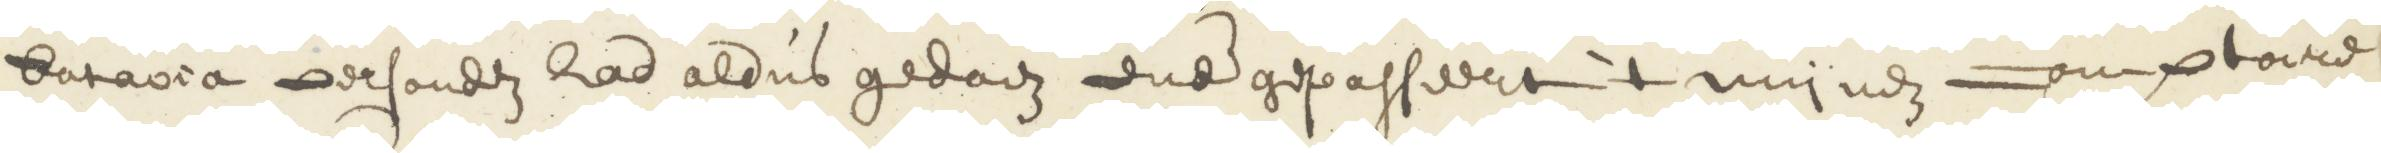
batavia versonden had aldus gedaen ende gepasseert ’t mijnen comptoire
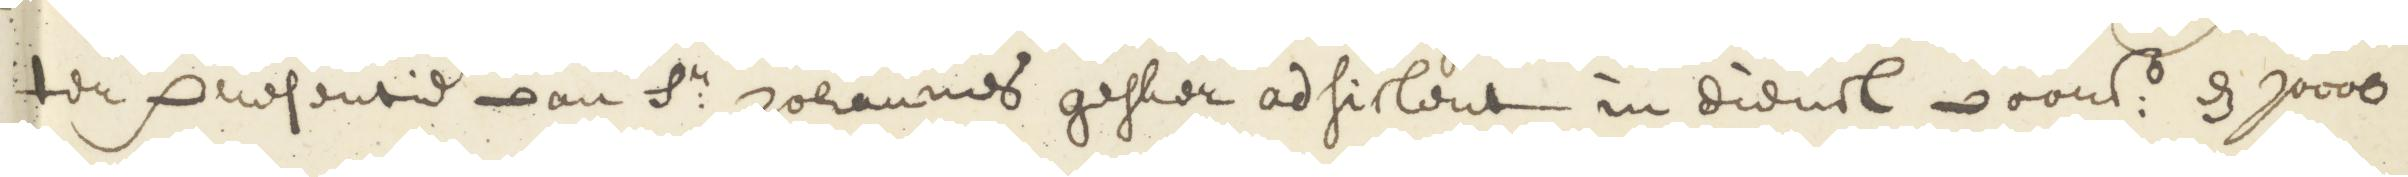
ter presentie van s:r Johannes gesker adsistent in dienst voors:z en Jacob
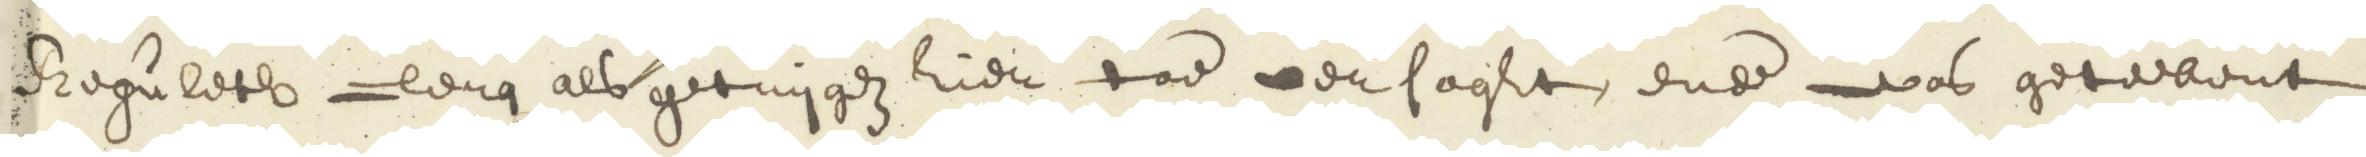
Reguleth clerq als getuijgen hier toe versoght, ende was geteekent
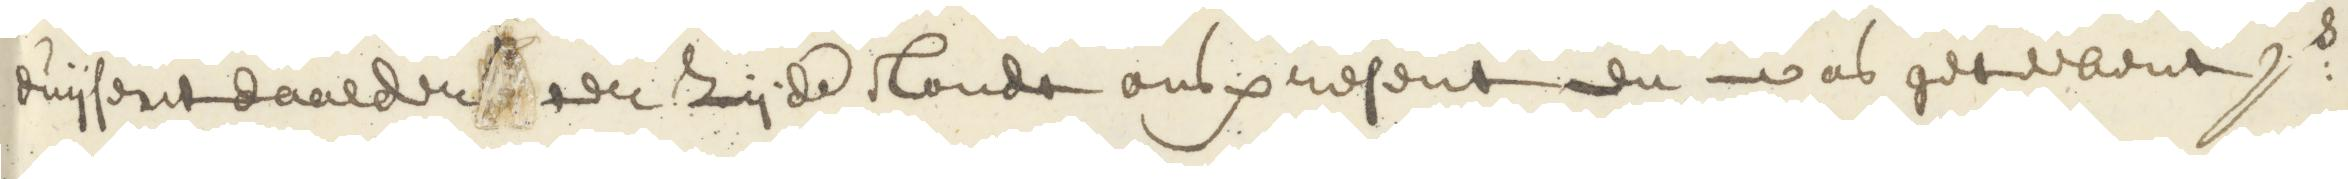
duijsentdaalder ter zijde stondt ons present en was geteekent J:s
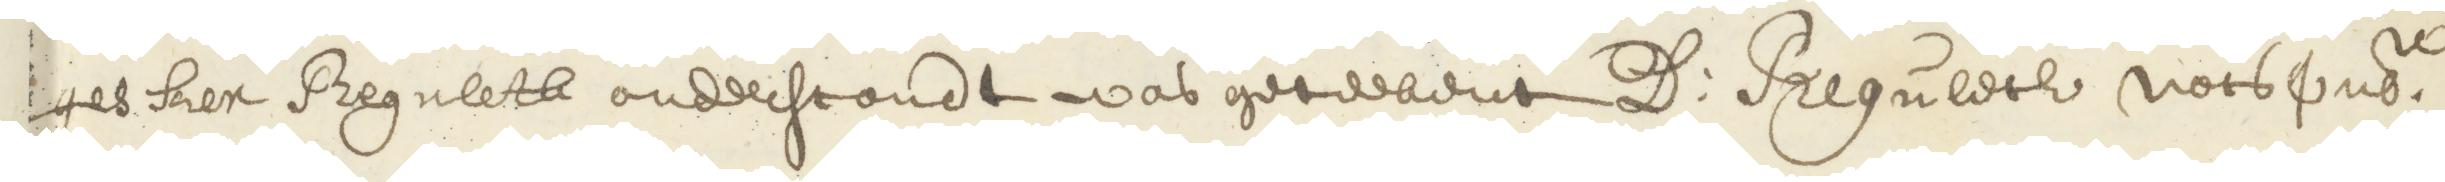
gesker Reguleth onderstondt was geteekent D: Reguleth nots pub.
